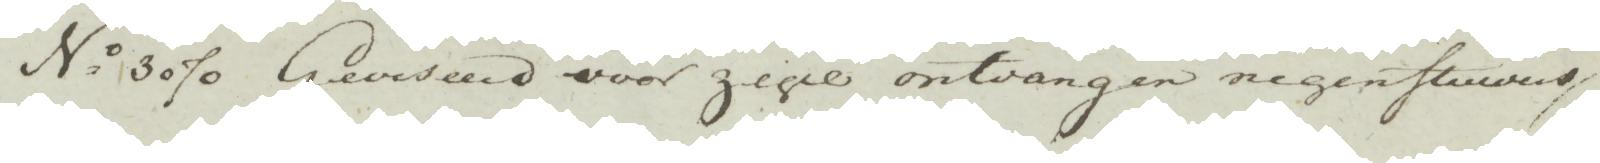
N=o 3070 Geviseerd voor zegel ontvangen negenstuivers
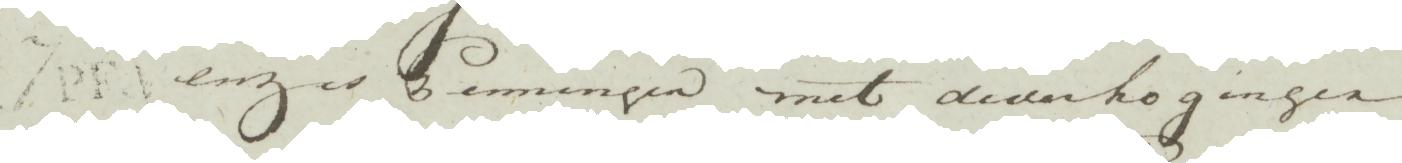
enz is Penningen met deverhogingen
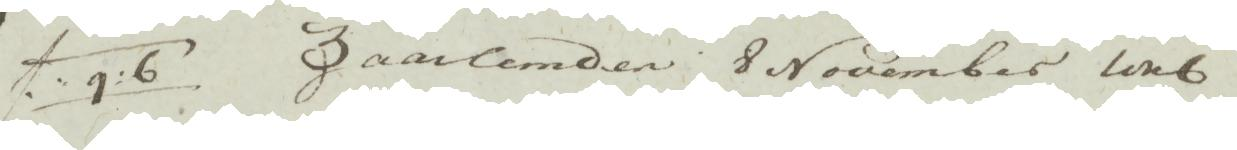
ƒ „ 4:6 Haarlemden 8 November 1815
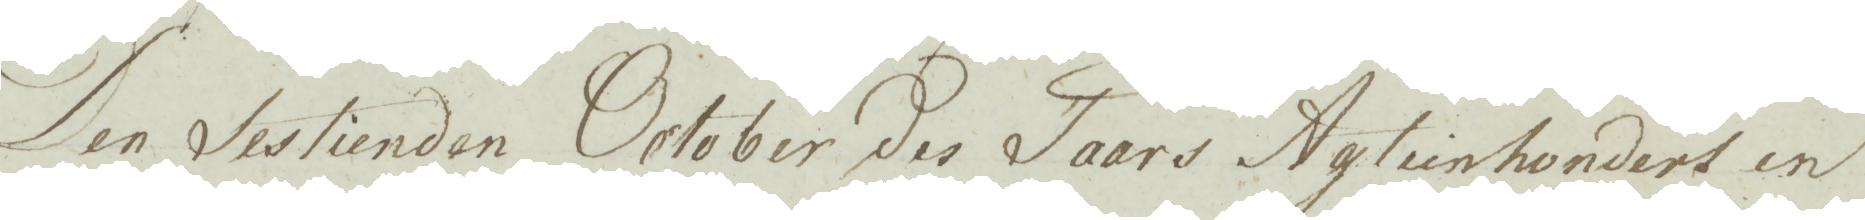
Den Sestienden October Der Iaars Agtienhondert en
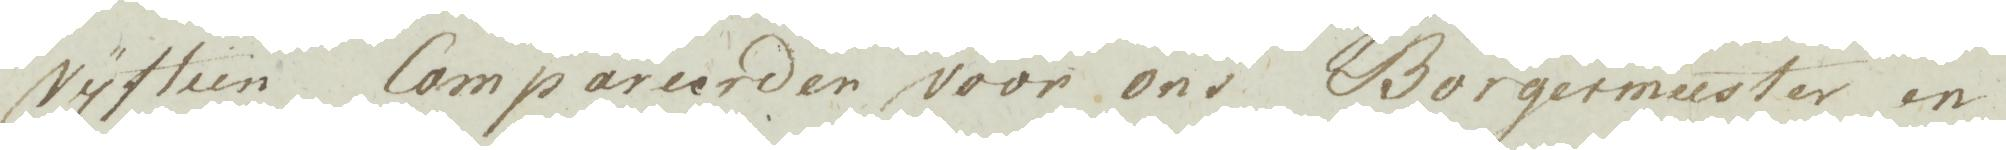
vijftien Compareerden voor ons Borgermeester en
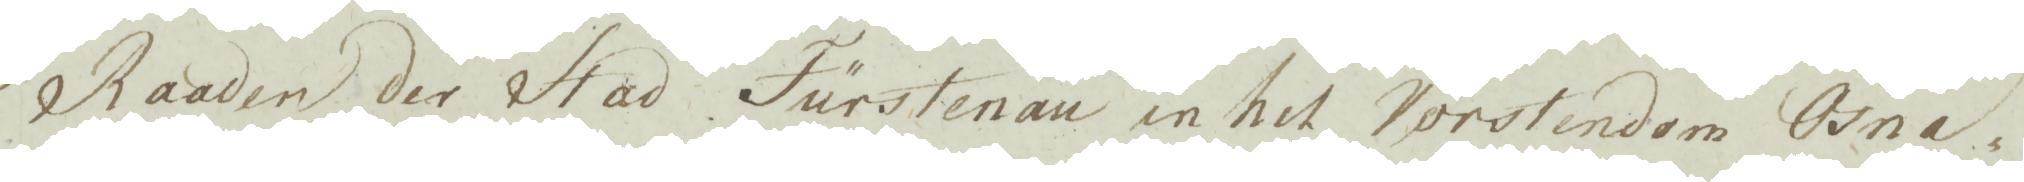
Raaden der Stad Fürstenau in het Vorstendom Osna„
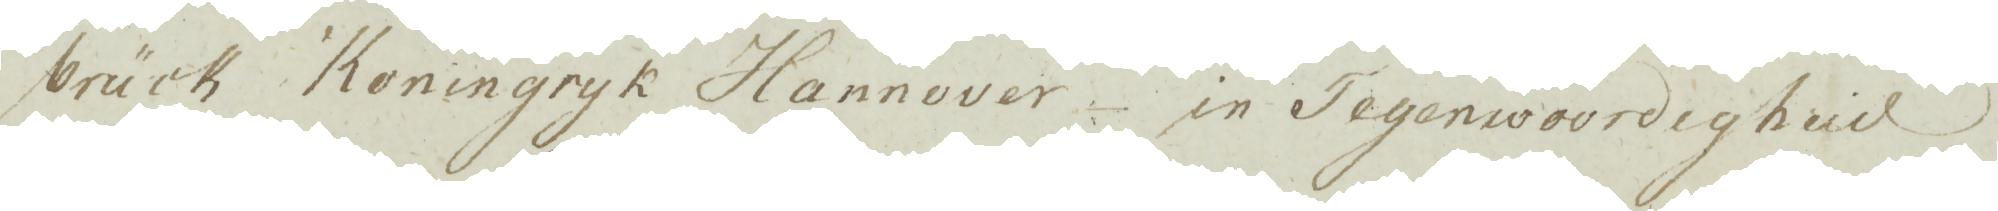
brück Koningryk Hannover - in Tegenwoordigheid
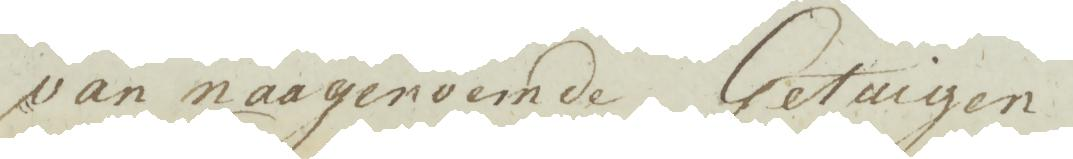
van naagenoemde Getuigen
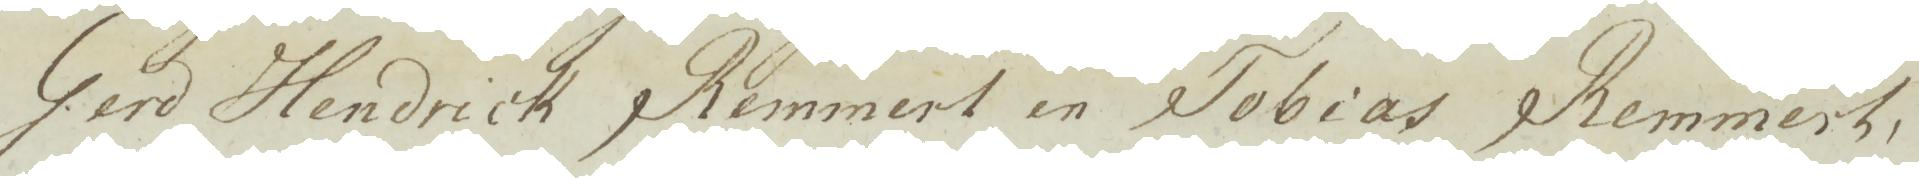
Gerd Hendrick Remmert en Tobias Remmert,
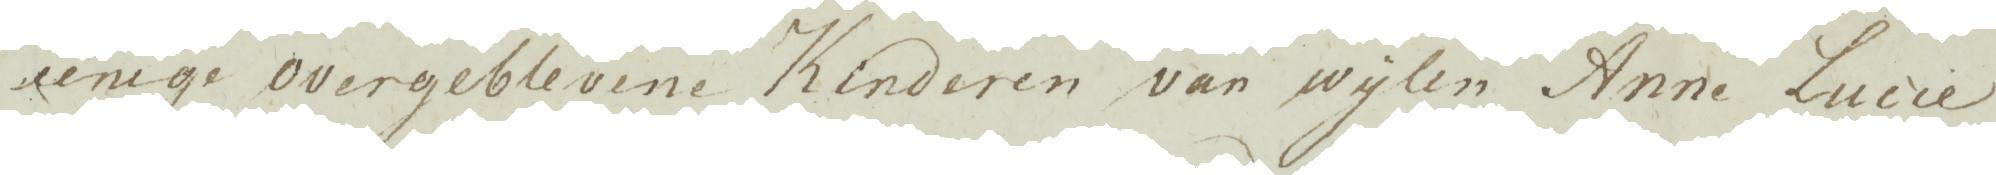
eenige overgeblevene Kinderen van wijlen Anne Lucie
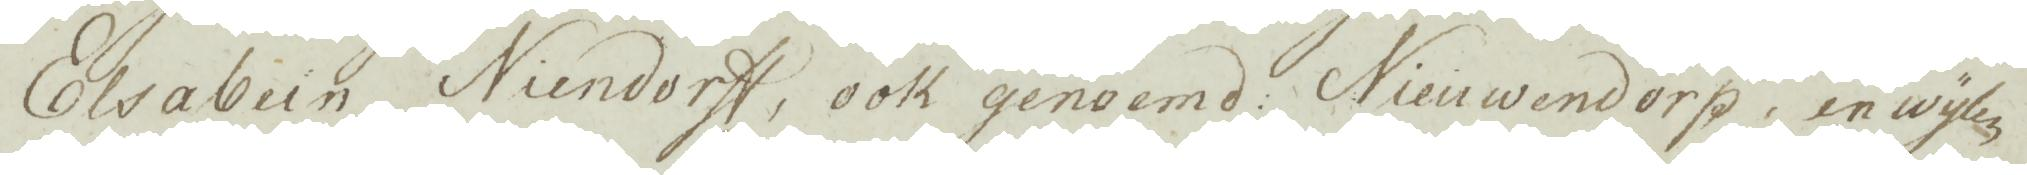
Elsabein Niendorff, ook genoemd Nieuwendorp, en wijlen
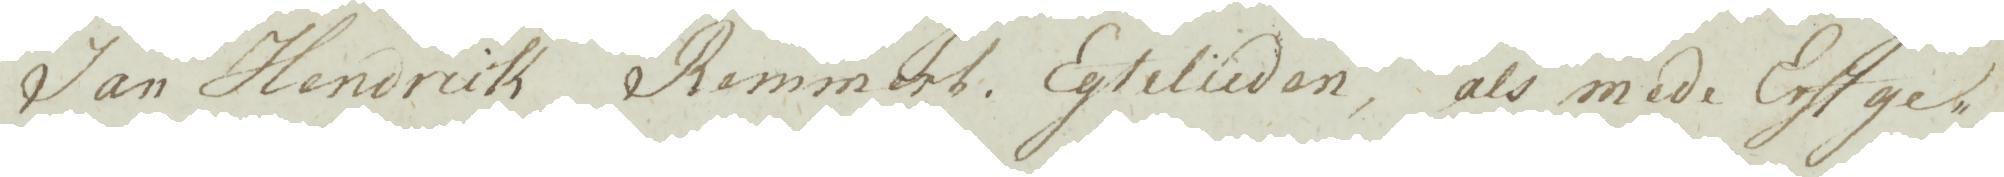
Jan Hendrick Remmert. Egtelieden, als mede Erff ge„
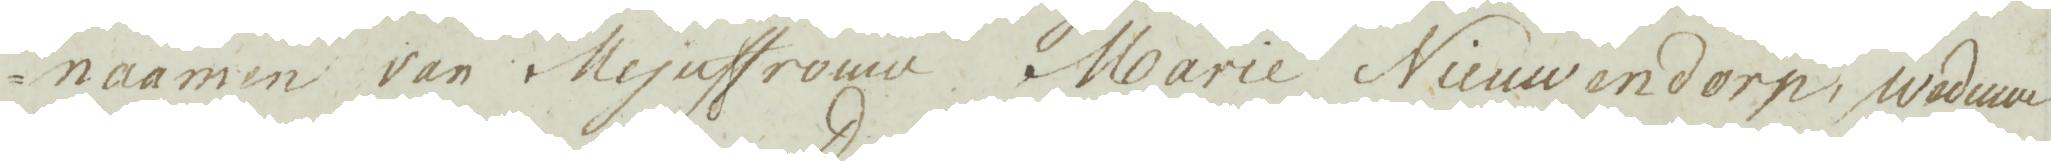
=naamen van Mejuffrouw Marie Nieuwendorp, weduwe
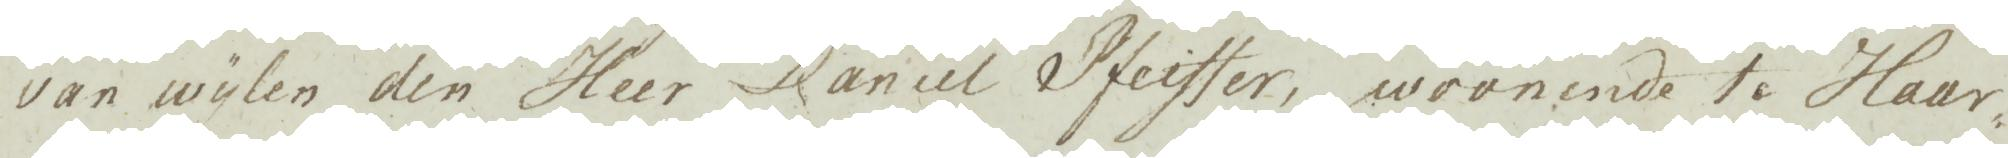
van wijlen den Heer Daniel Pfeiffer, woonende te Haar
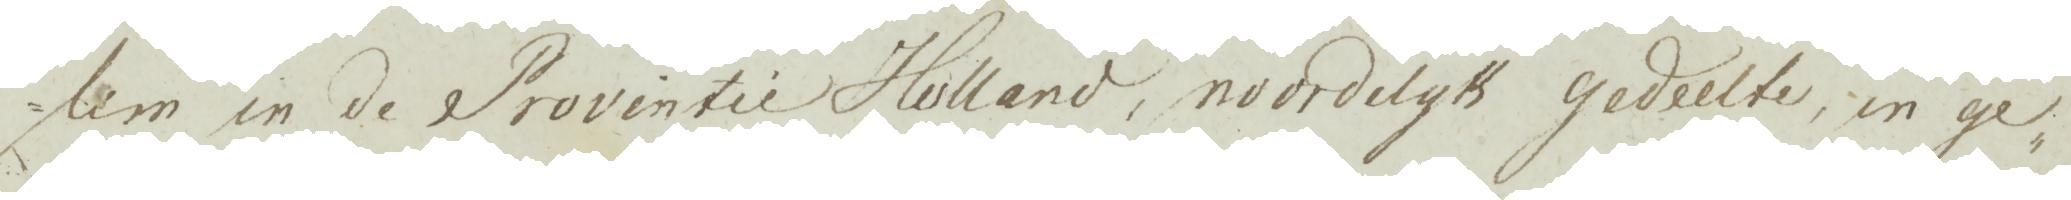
=lem in de Provintie Holland, noordelijk gedeelte, in ge„
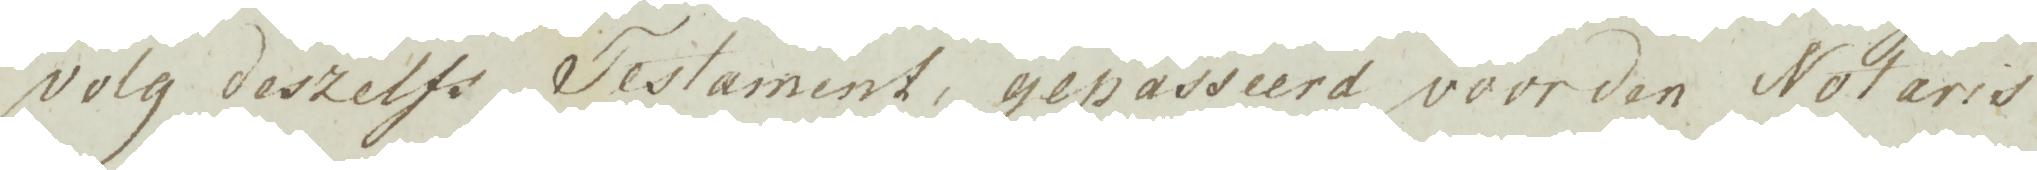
volg deszelfs Testament, gepasseerd voor den Notaris
